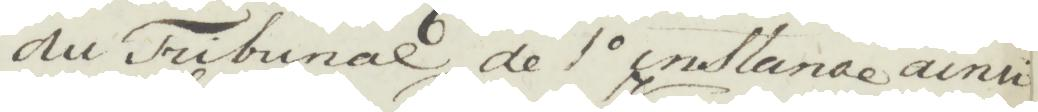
du Tribunal de 1o Instance ainu
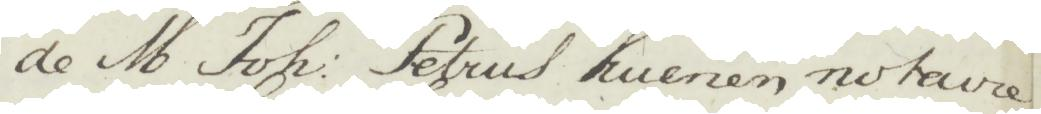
de M Joh: Petrus Kuenen notaire
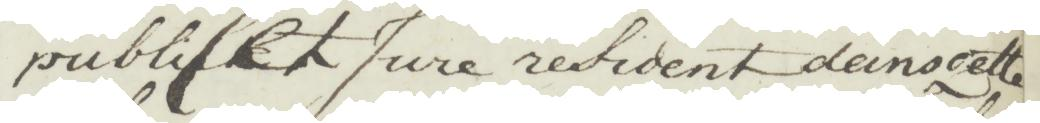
public et Juré resident dans cette
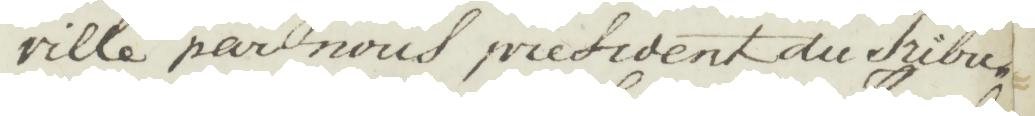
ville par nous president du Tribu„
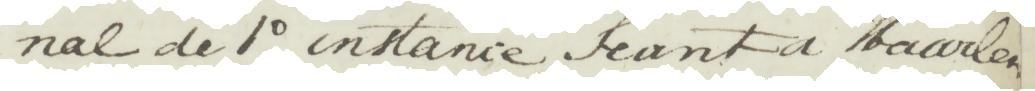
nal de 1o instance Seant a Haarlem
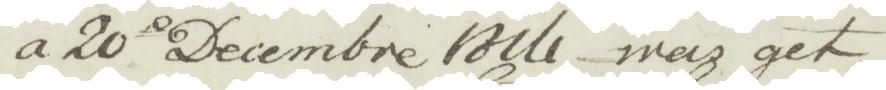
a 20:e Decembre 1814 was get
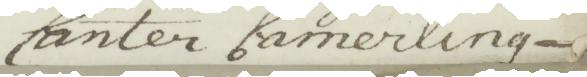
Canter Cameling—
